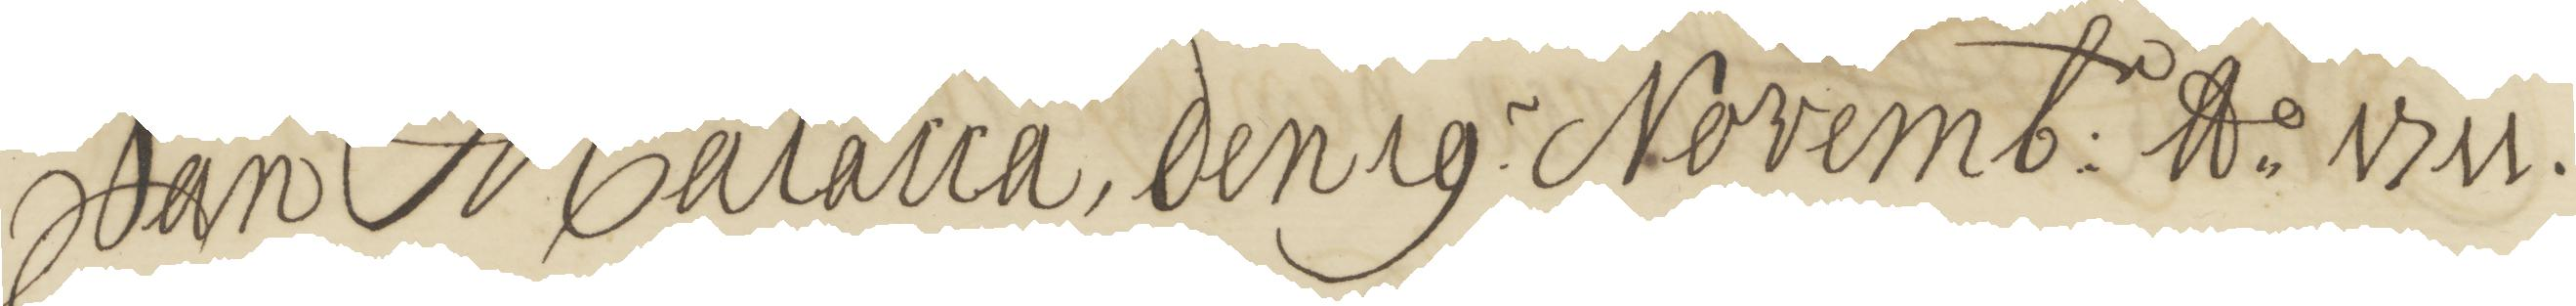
Van Malacca, den 19.' Novemb:r A„o 1711.
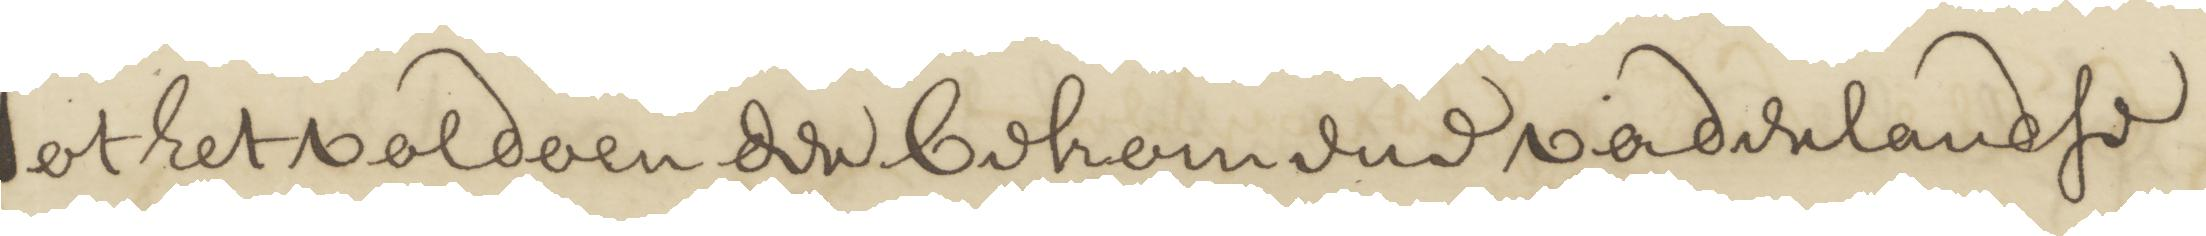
tot het voldoen der bekomene vaderlandse
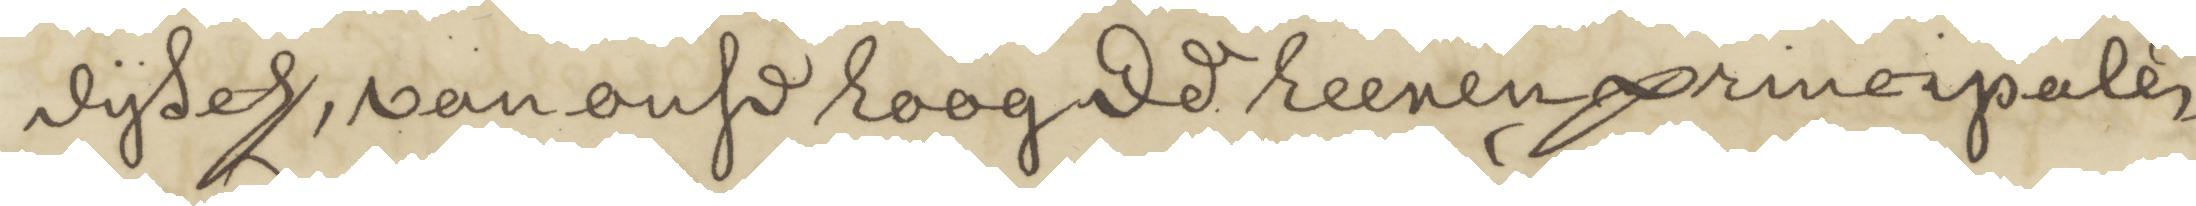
eijsch, van onse hoog Ed.' heeren principalen
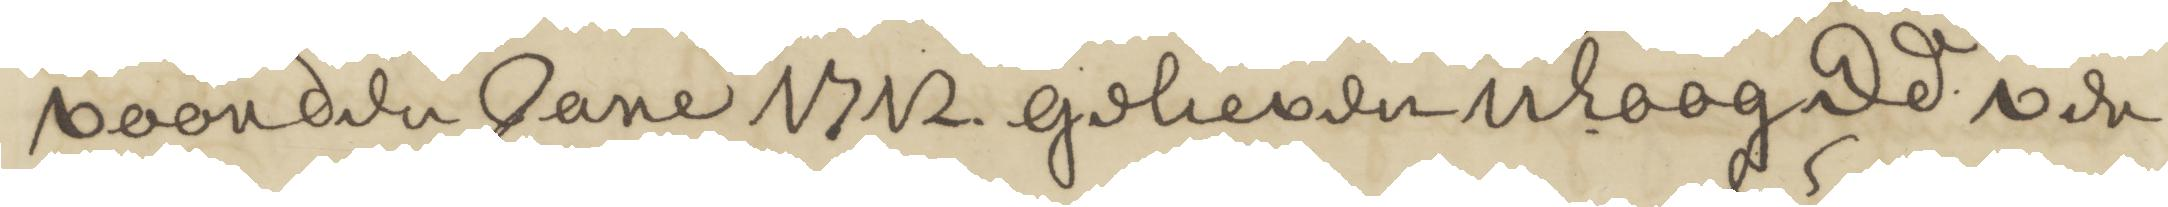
voor den Jare 1712. gelieven u hoog Ed:' ver
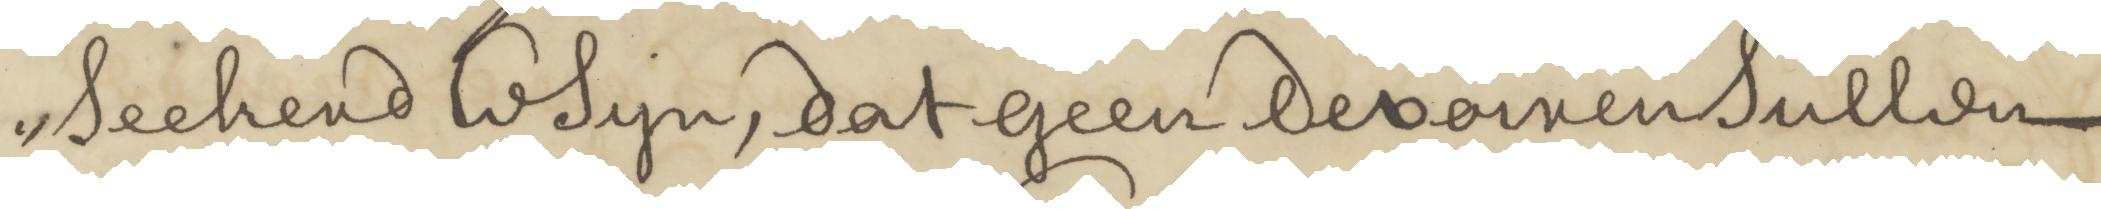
„Seekerd te Sijn, dat geen devoiren Sullen
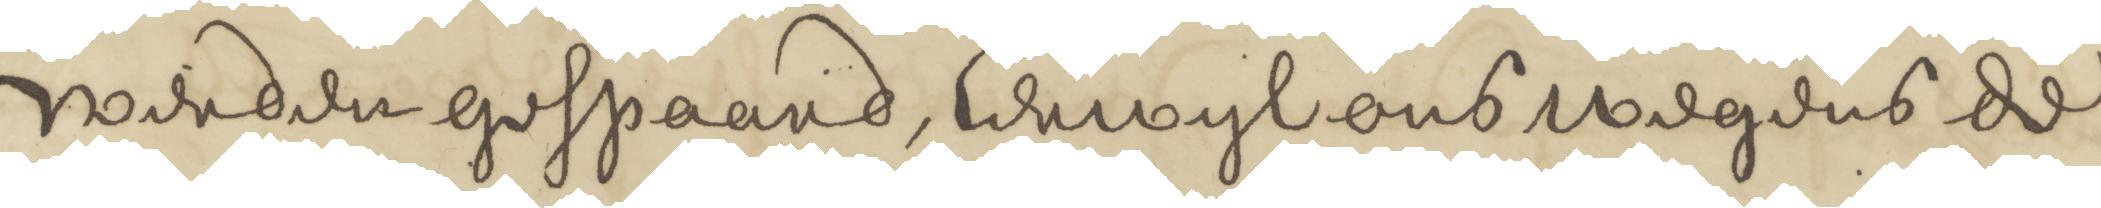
werden gespaard, terwyl ons wegens de
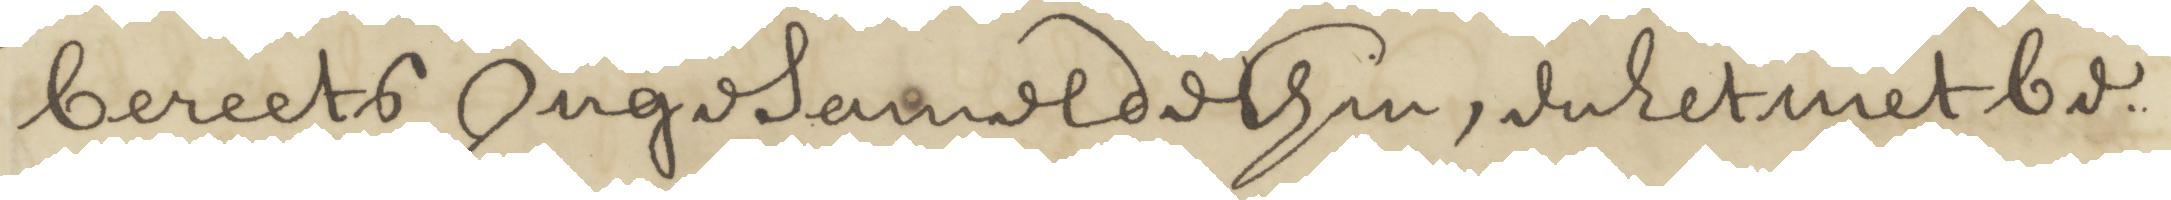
bereets Jngesamelde thin, enhet niet be„
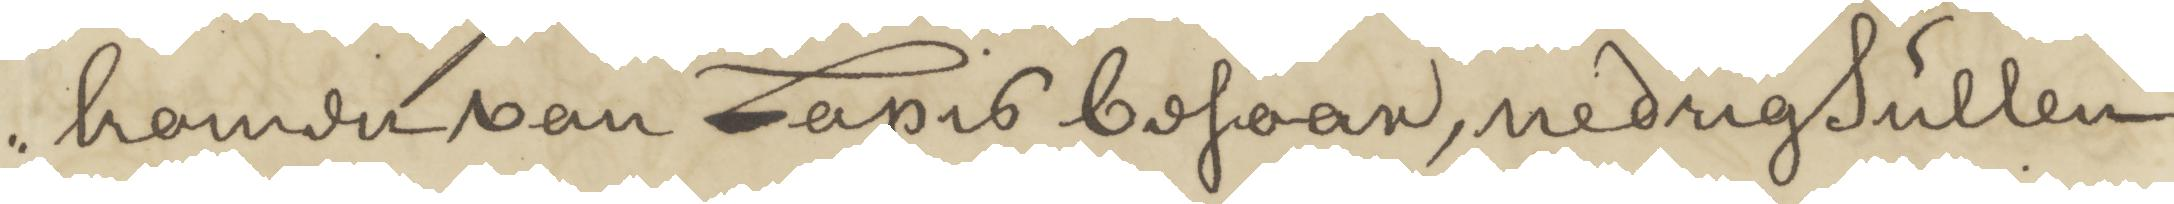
„ komen van Lapis besaar, nedrig Sullen
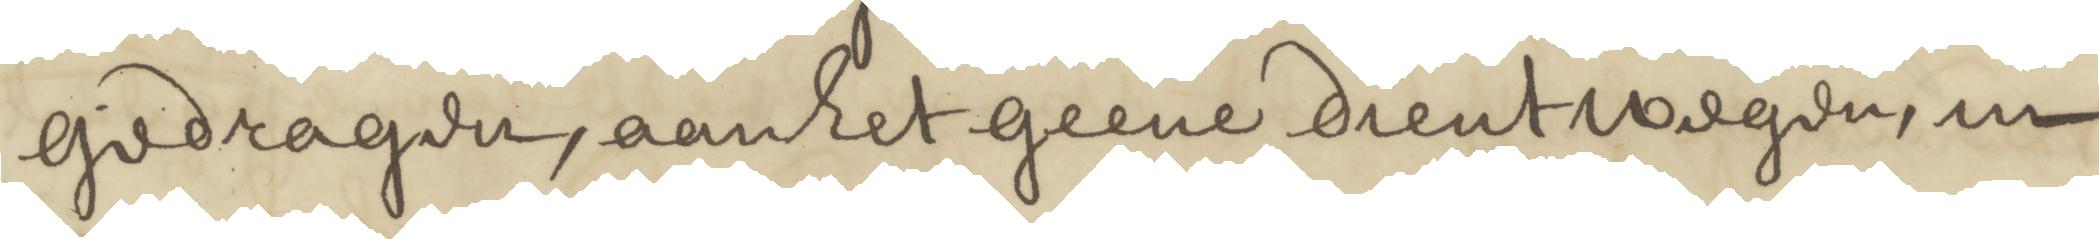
gedragen, aan het geene dient wegen, in
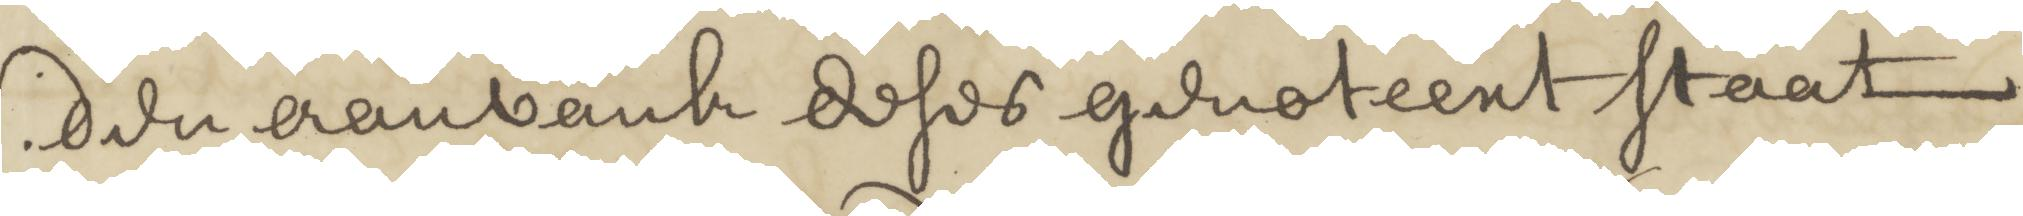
.den aanvank deses genoteert staat
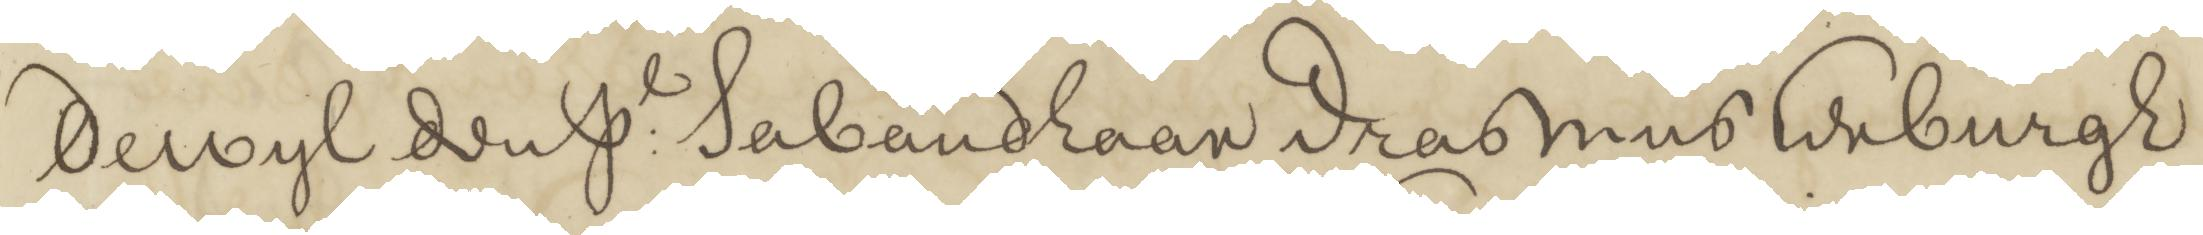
dewyl den p:l Sabandhaar Erasmus terburgh
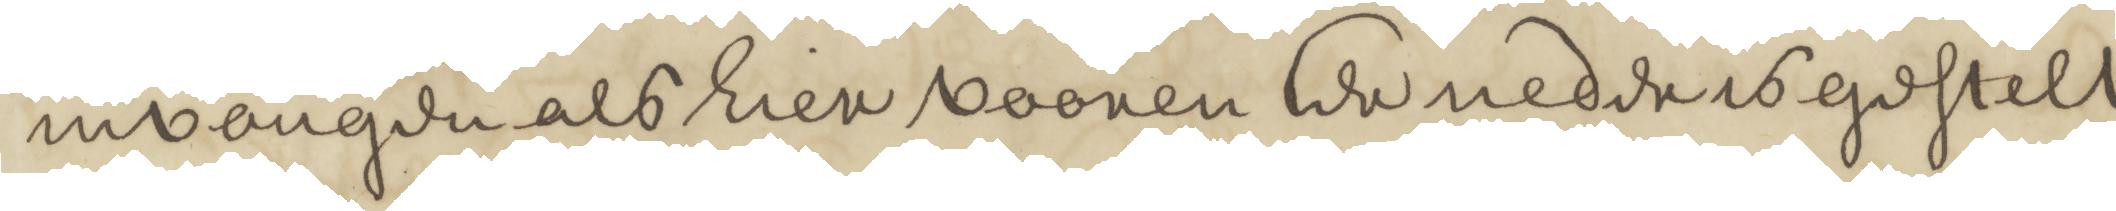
invougen als hier vooren ter neder is gestelt
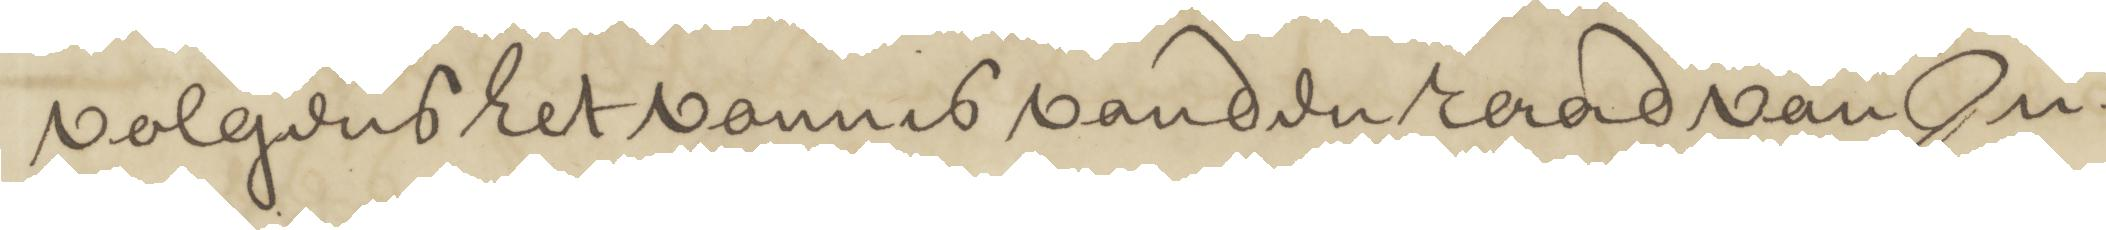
volgens het vonnis van den raad van Ju
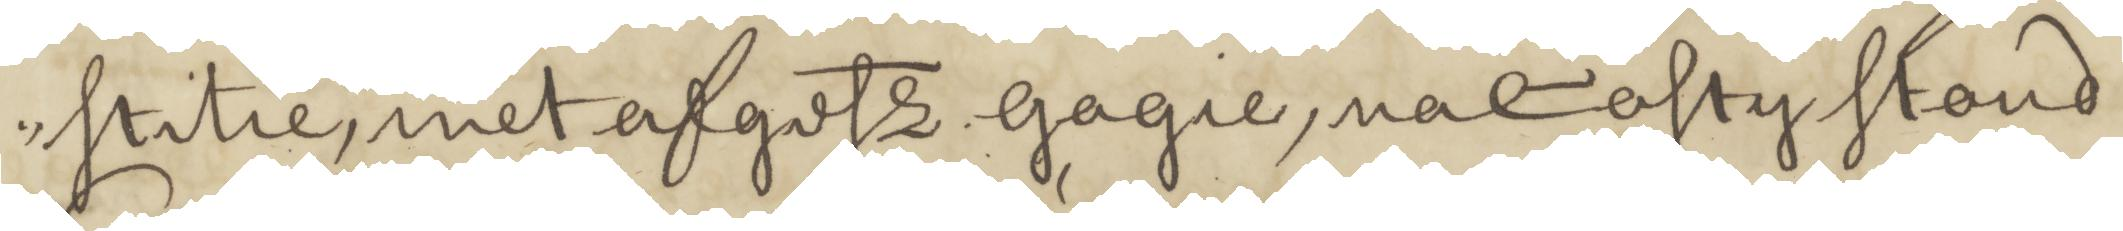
„stitie, met afgesz. gagie, na Costij stond
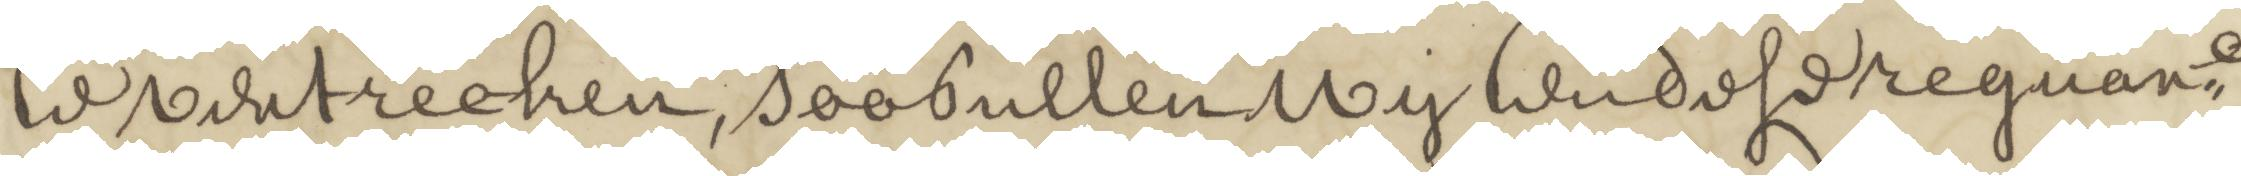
te vertrecken, Soo sullen wij tendese reguar„
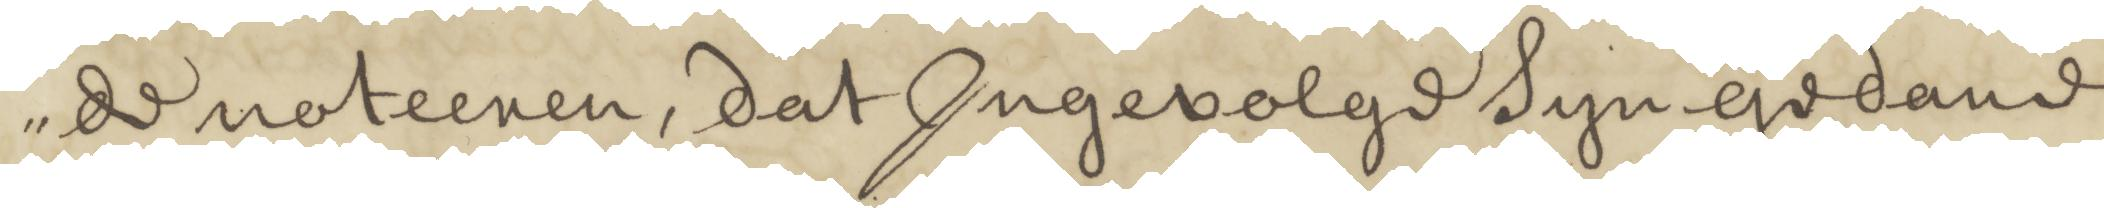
„ de noteeren, dat Ingevolge Sijn gedane
